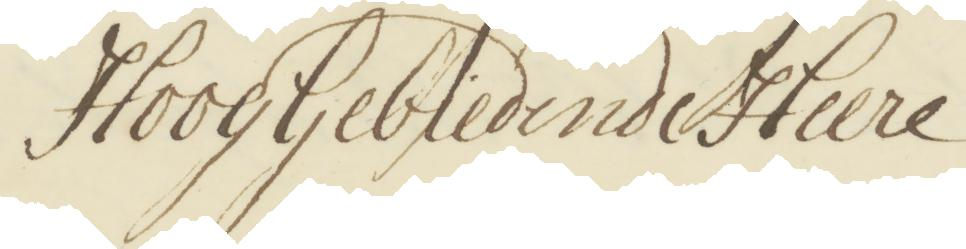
Hoog Gebiedende Heere
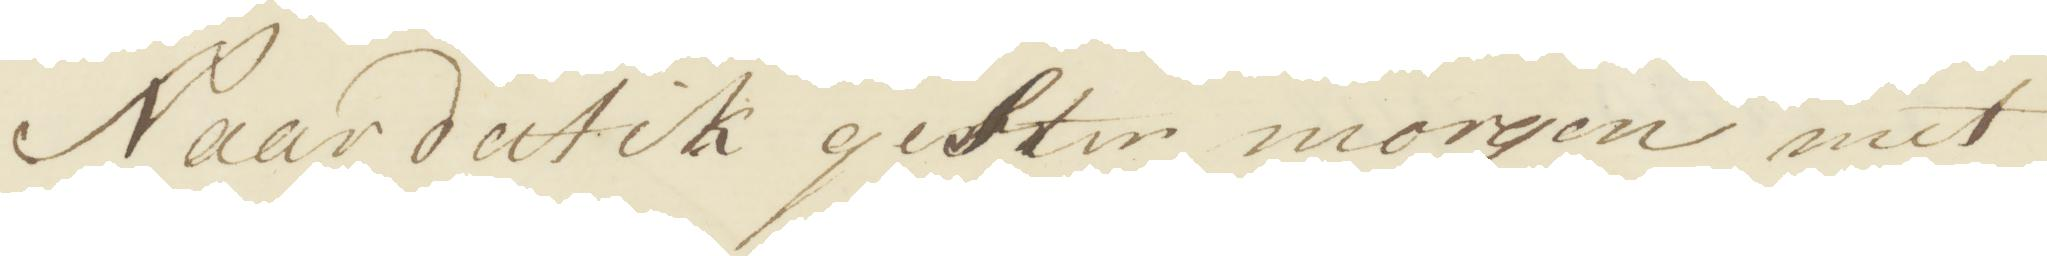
Naar dat ik gester morgen met
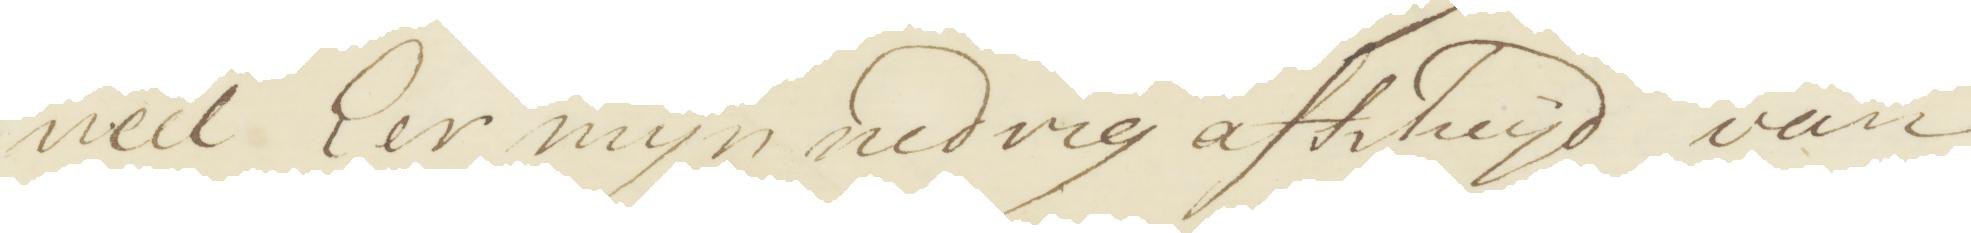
veel Eer mijn nedrig afscheijd van
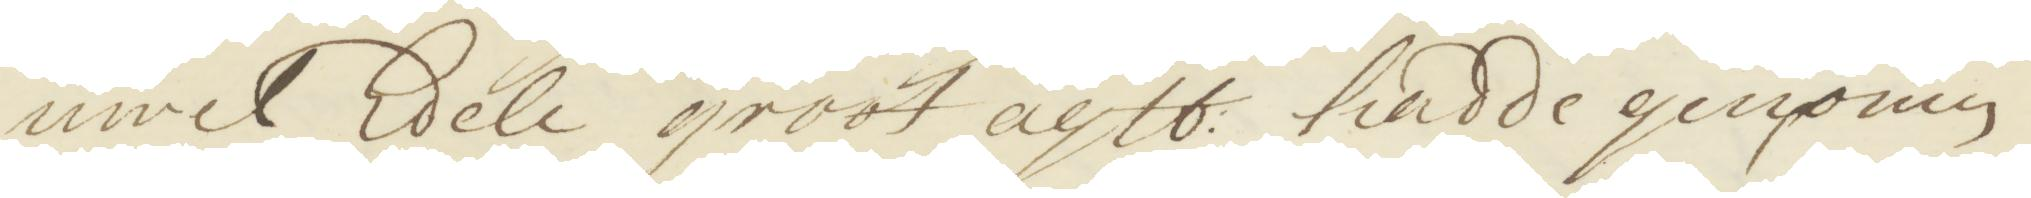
uwel Edele groot agtb: hadde genomen
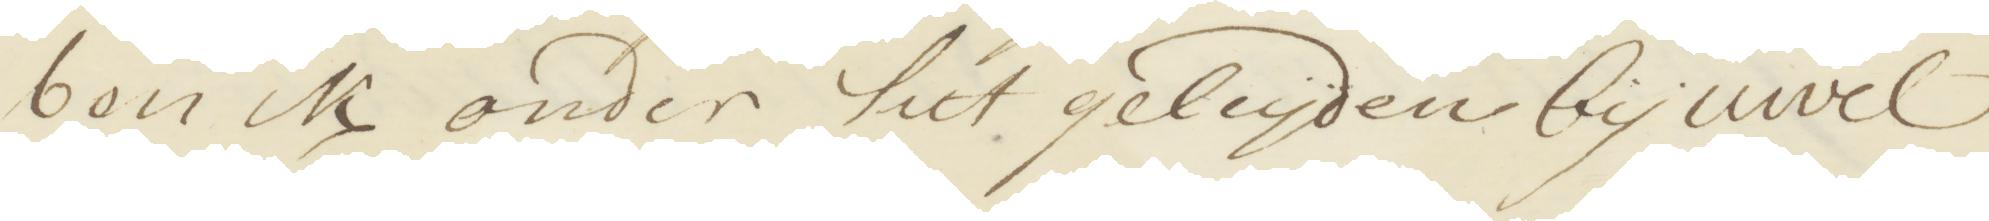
ben ik onder het geleijden bij uwel
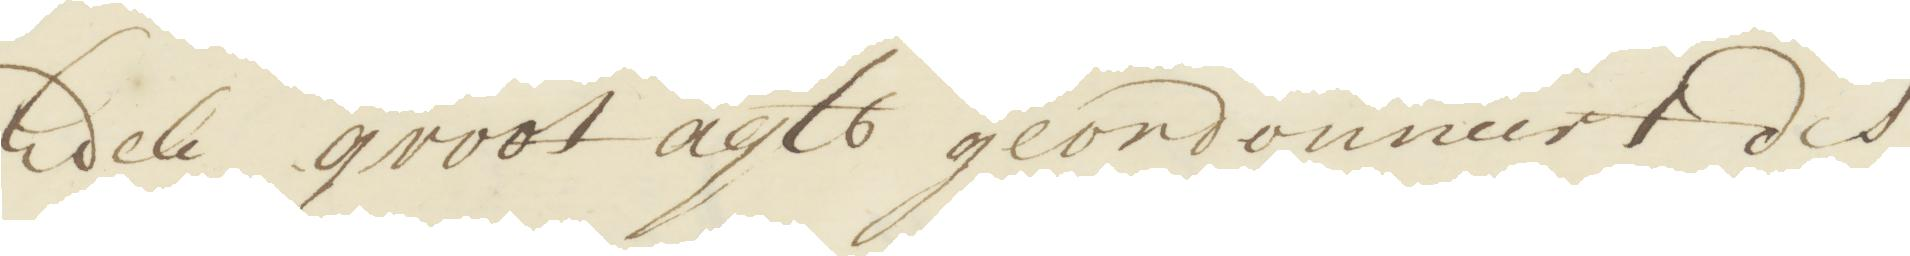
Edele groot agtb geordonneert des
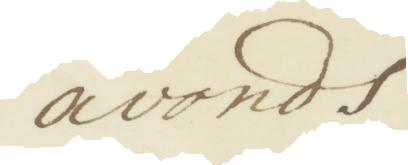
avonds
